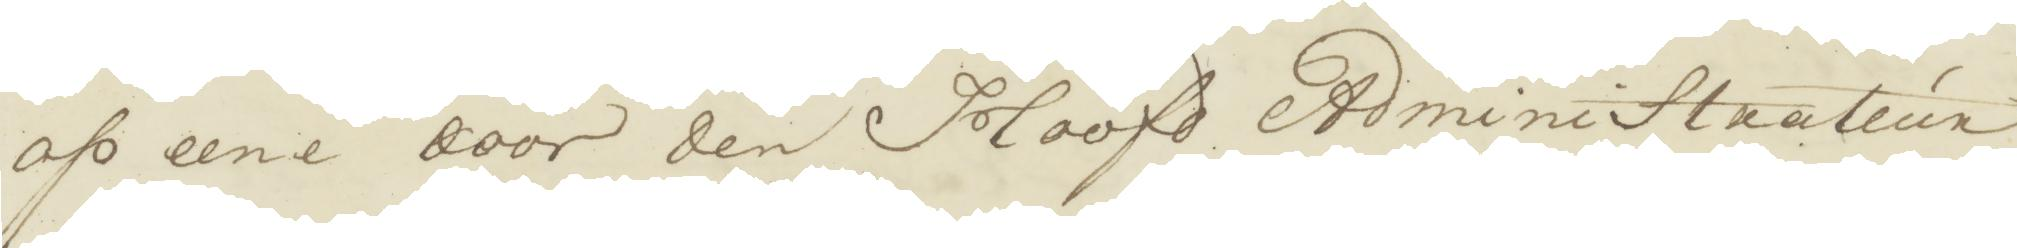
op eene door den Hoofd Administrateur
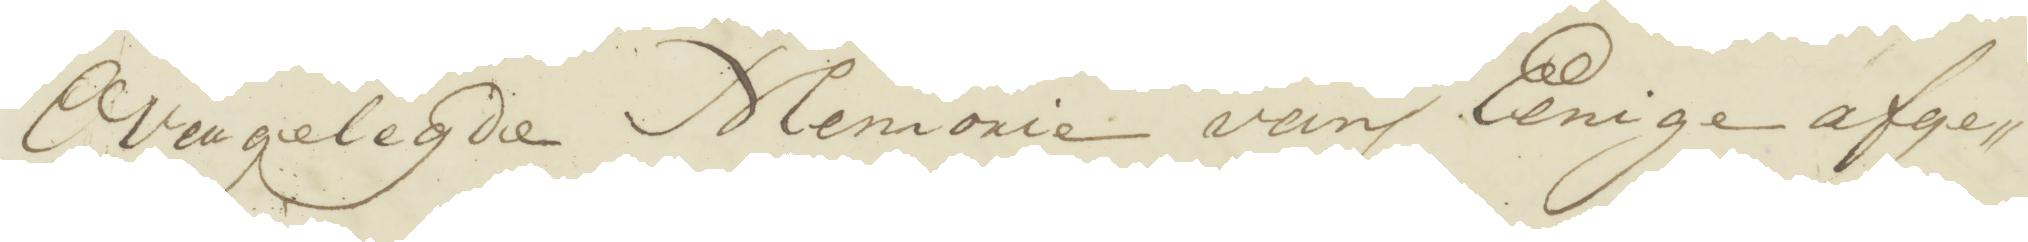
Overgelegde Memorie van Eenige afge„
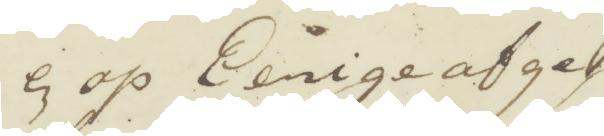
en op Eenige afge
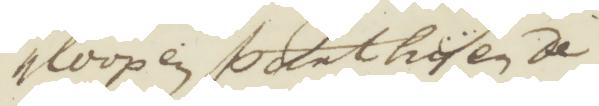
„loopen parthijen de
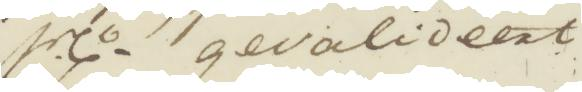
p.C-o gevalideert
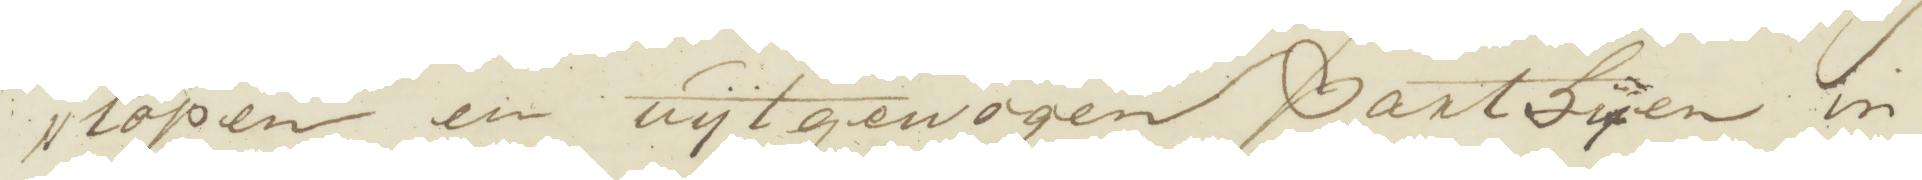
„lopen en uijtgewogen Parthijen in
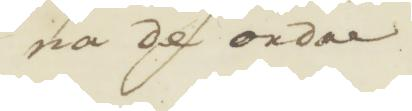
na de ordre
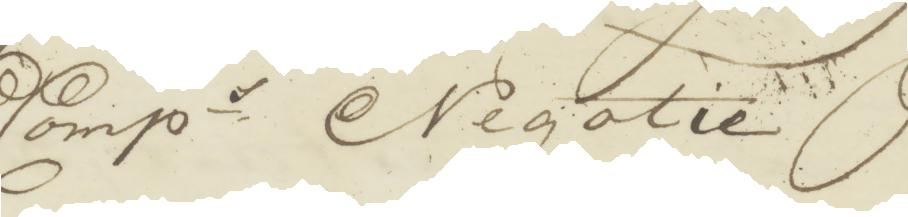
S Comp:s Negotie Pakhuijs en Pro
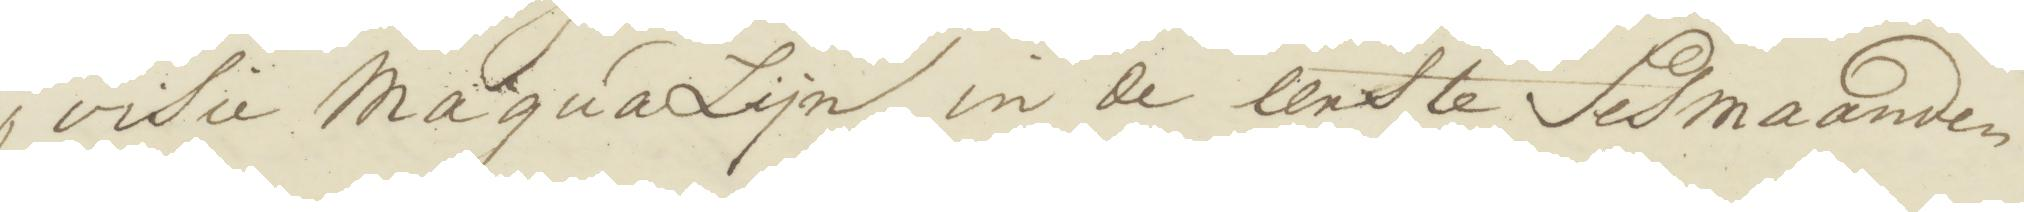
„visie Maguazijn in de eerste Ses maanden
